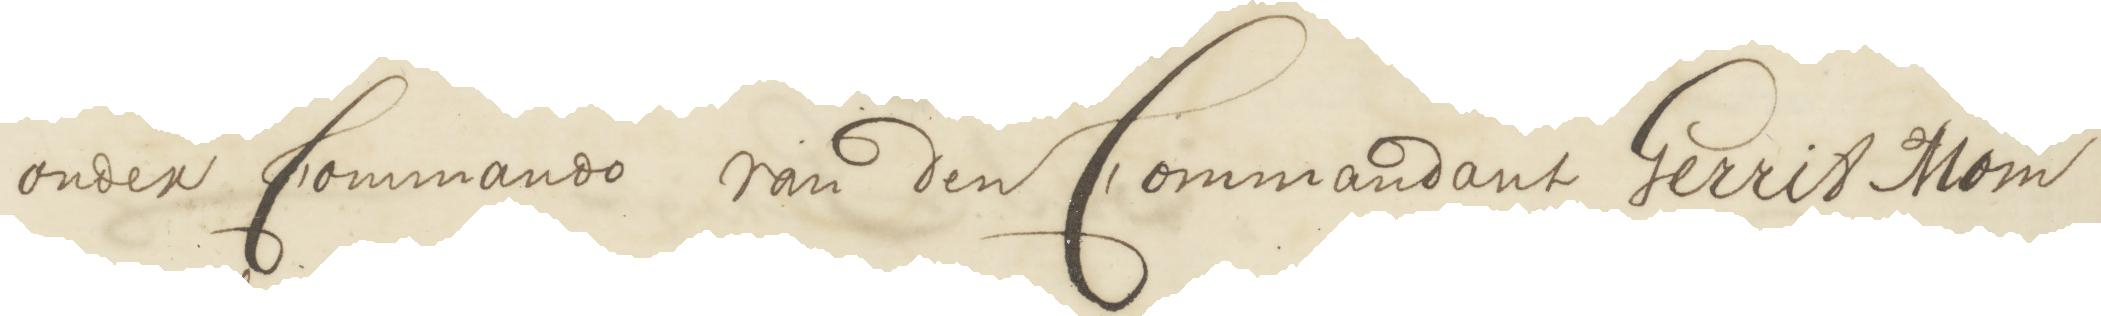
onder Commando van den Commandant Gerrit Mom
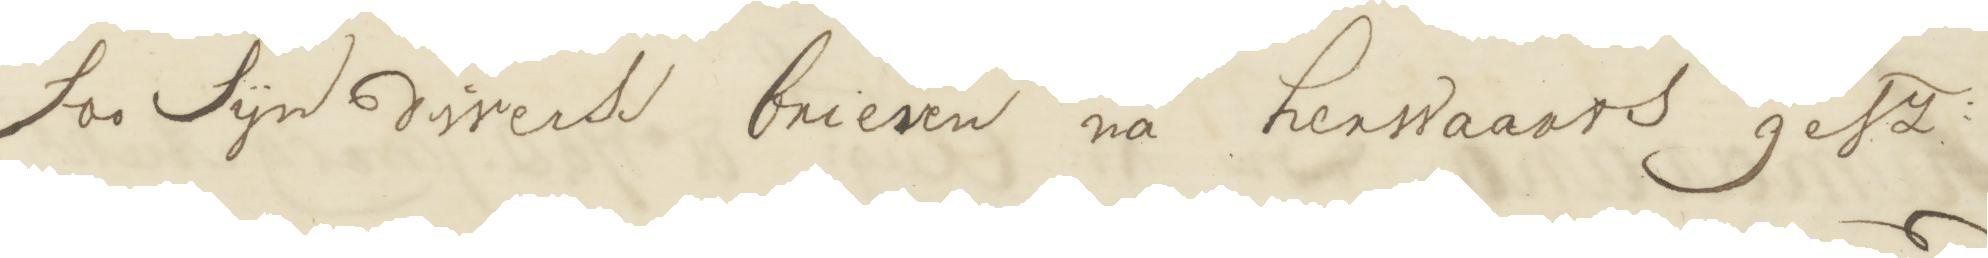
soo sijn divers brieven na herwaarts gesz:
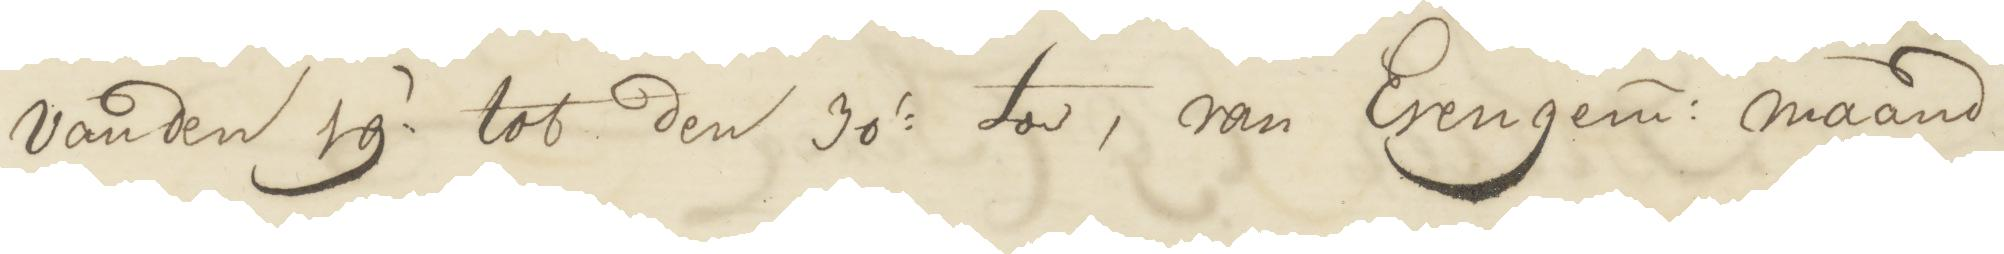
van den 19:' tot den 30:' toe, van Evengem: maand
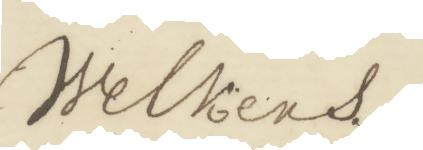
welkers
